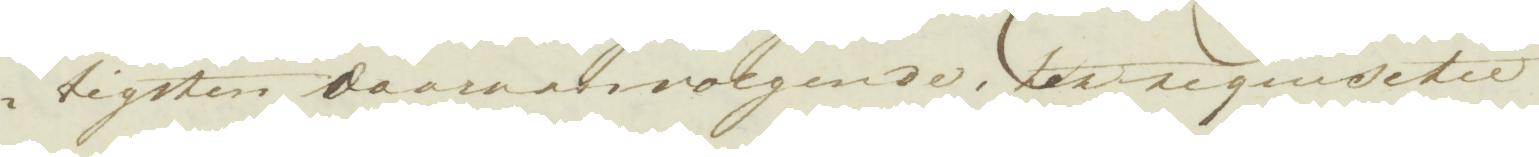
„tigsten daaraanvolgende, ter requisitie
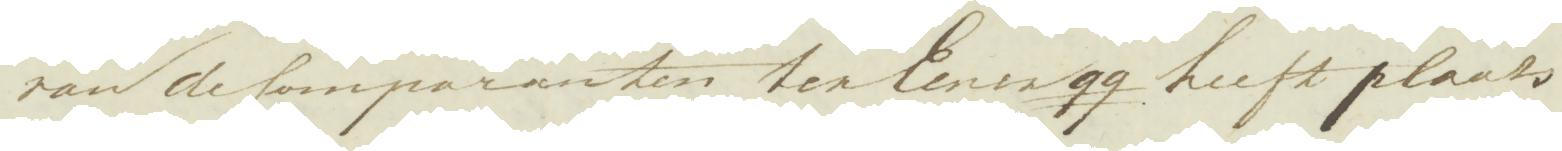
van de Comparanten ter Eener qq heeft plaats
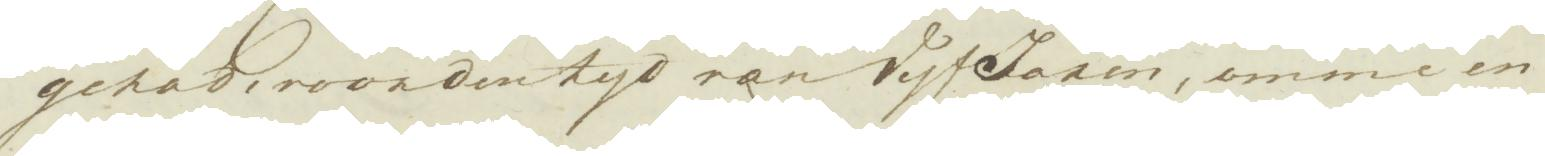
gehad, voor den tyd van Vyf Jaren, omme en
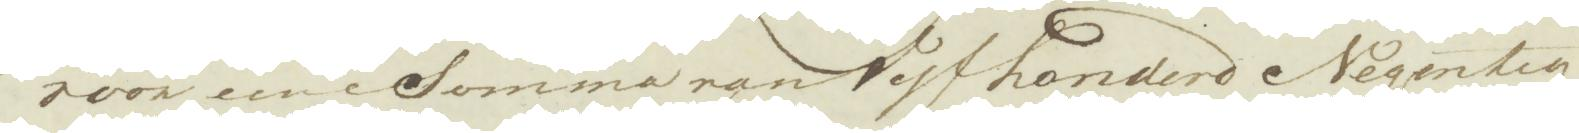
voor eene somma van Vyf honderd Negentig
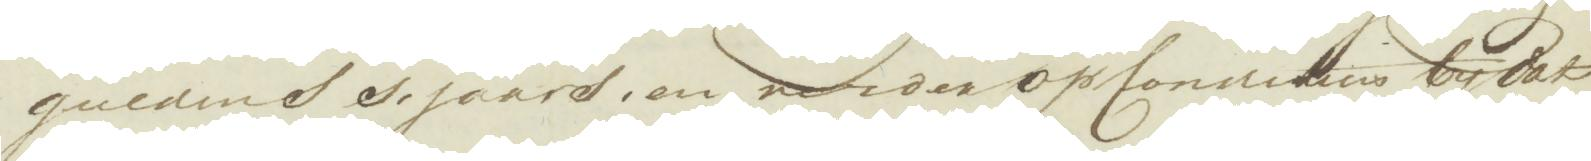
guldens s'jaars, en verder op Conditien by dat
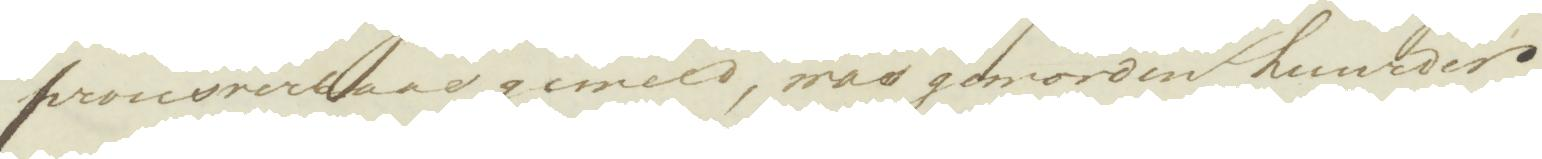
procesverbaal gemeld, was geworden huurder
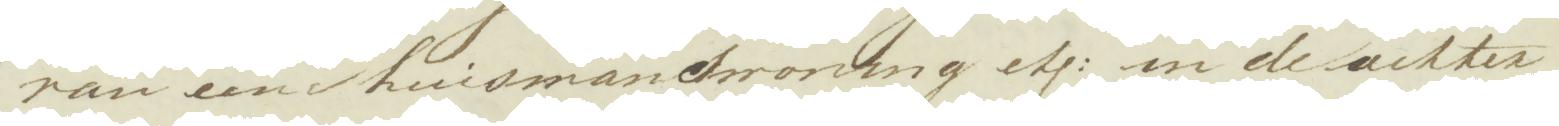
van eene huismanswoning etc: in de achter
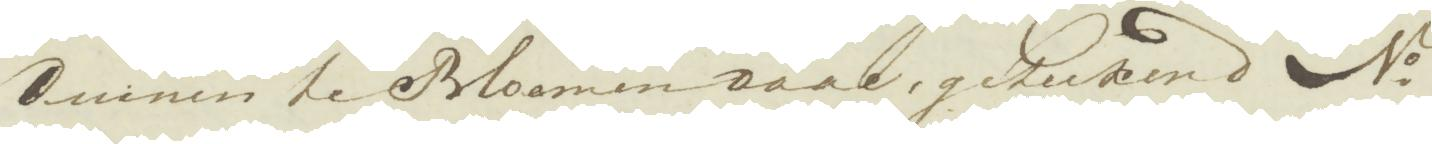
Duinen te Bloemen daar, geteekend N.o
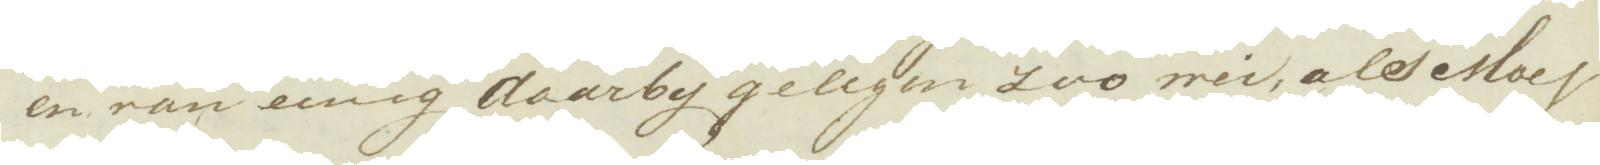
en van eenig daarby gelegen zoo wei, als Moes
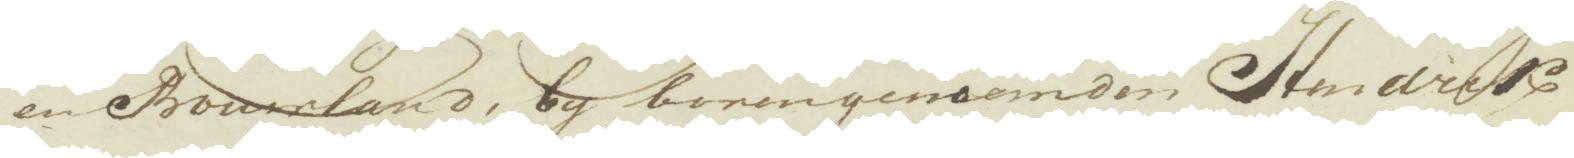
en Bouwland, by bovengenoemden Hendrik
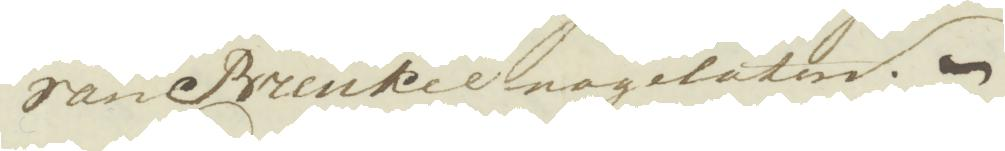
van Breukel nagelaten. -
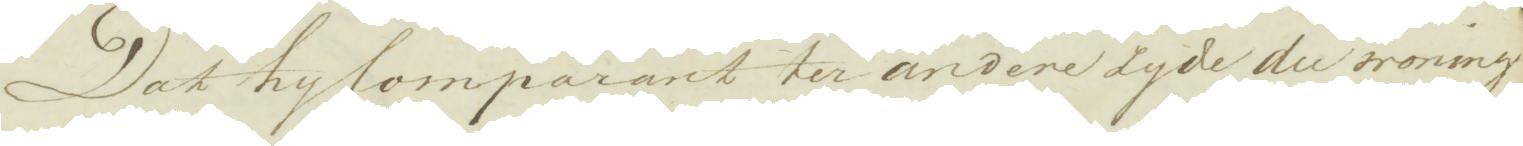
Dat hy Comparant ter andere zyde die woning
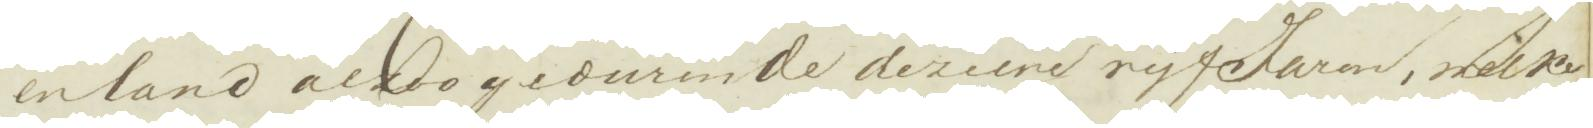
en land alzoo gedurende dezelve vyf Jaren, welke
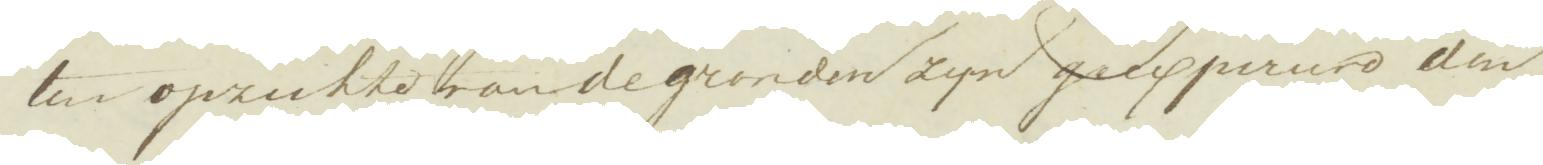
ten opzichte van de gronden zyn geexpireerd den
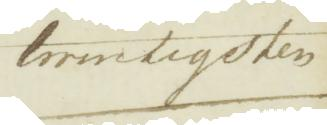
twintigsten
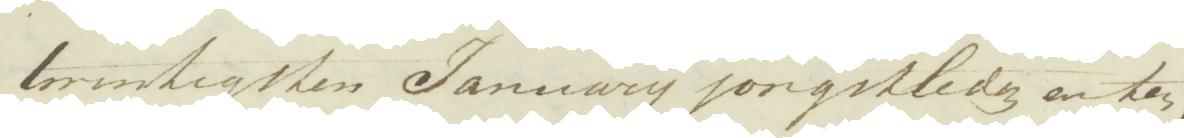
twintigsten January jongstleden en ten
